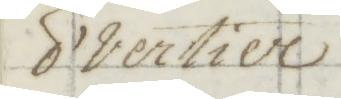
d’vertier
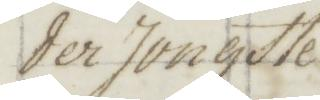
der Jongste
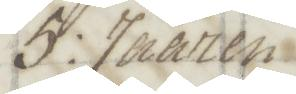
5: Jaaren
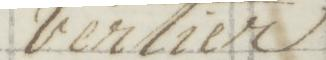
Vertier
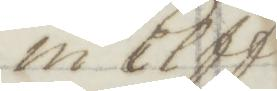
in Elff
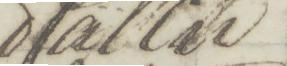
d' Calcu
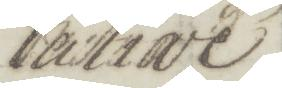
lative
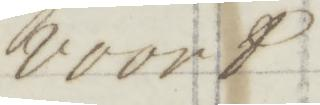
voort
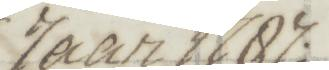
Jaar 1787:
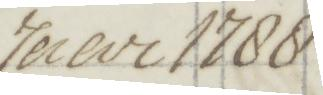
Jaar 1788
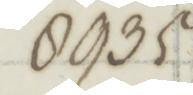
8935
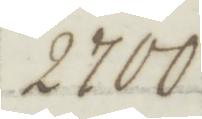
2700
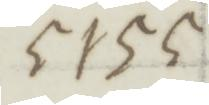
5155
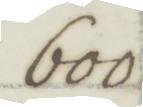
600
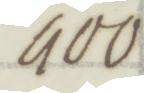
400
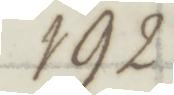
192
